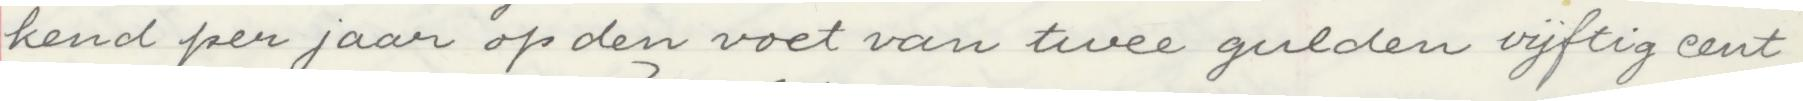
kend per jaar op den voet van twee gulden vijftig cent
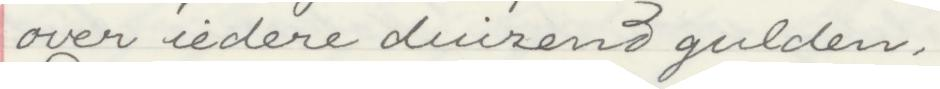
over iedere duizend gulden,
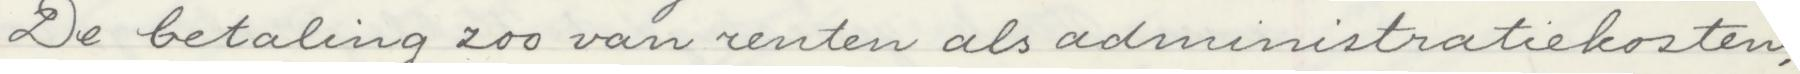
De betaling zoo van renten als administratie kosten,
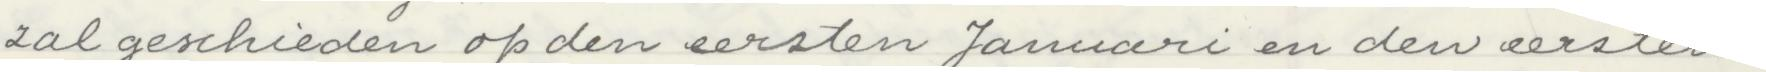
zal geschieden op den eersten Januari en den eersten
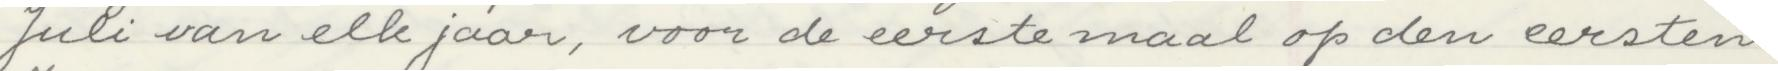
Juli van elk jaar, voor de eerste maal op den eersten
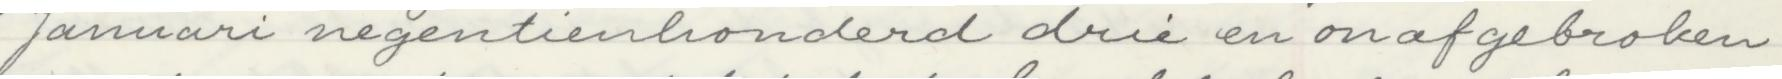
Januari negentienhonderd drie en onafgebroken
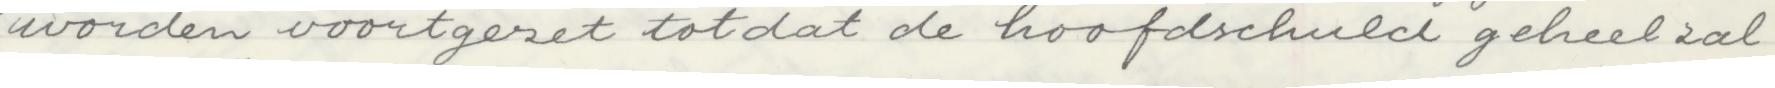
worden voortgezet totdat de hoofdschuld geheel zal
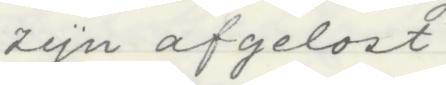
zijn afgelost
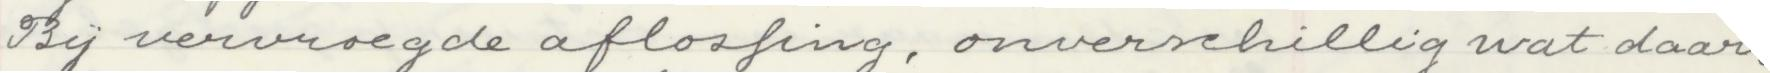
Bij vervroegde aflossing, onverschillig wat daar
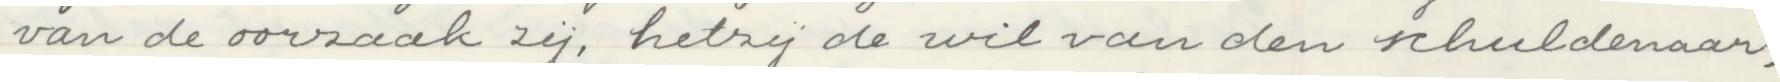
van de oorzaak zij, hetzij de wil van den schuldenaar-
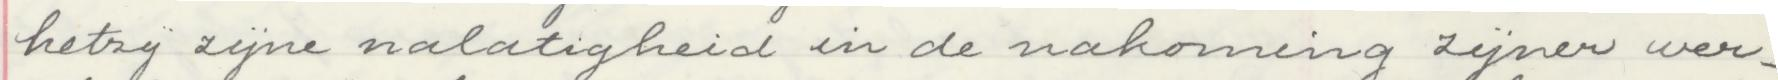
hetzij zijne nalatigheid in de nakoming zijner ver
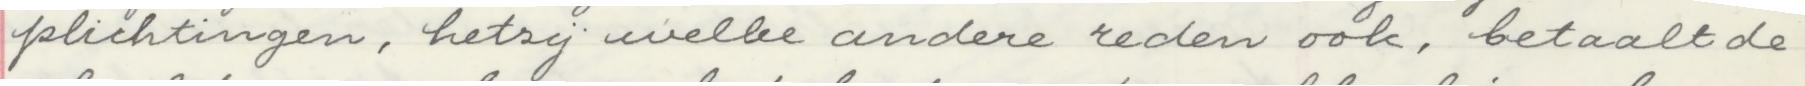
plichtingen, hetzij welke andere reden ook, betaalt de
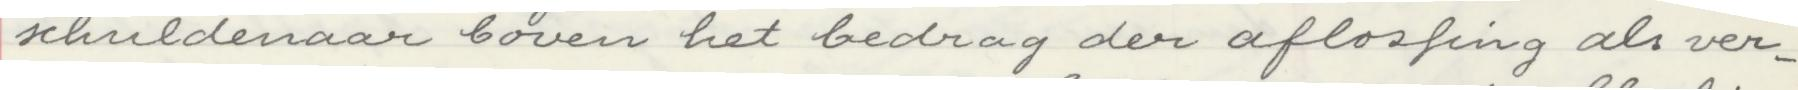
schuldenaar boven het bedrag der aflossing als ver-
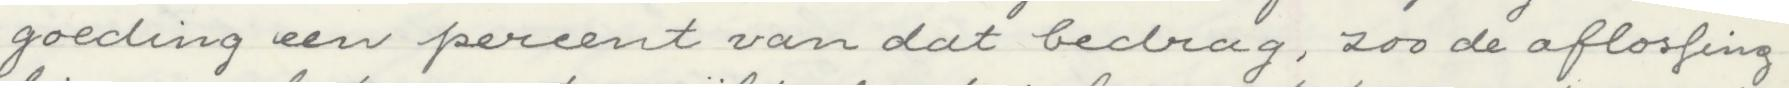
goeding een percent van dat bedrag, zoo de aflossing
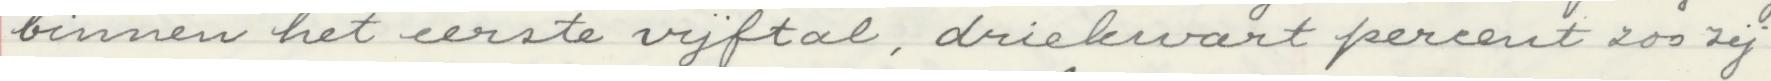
binnen het eerste vijftal, driekwart percent zoo zij
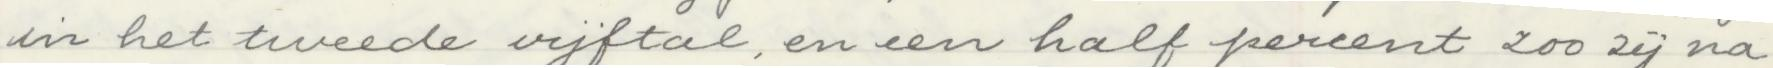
in het tweede vijftal, en een half percent zoo zij na
